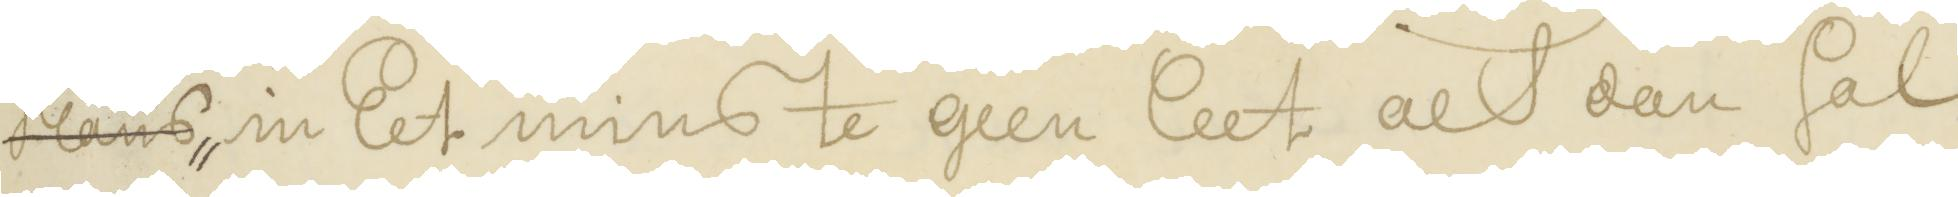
fhans„ in het minste geen leet als dan sal
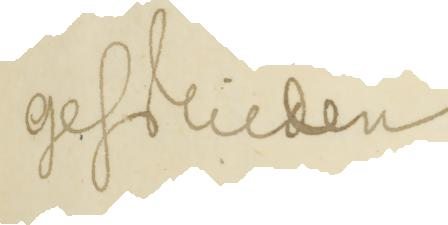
geschieden.
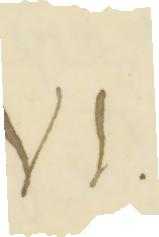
VI.
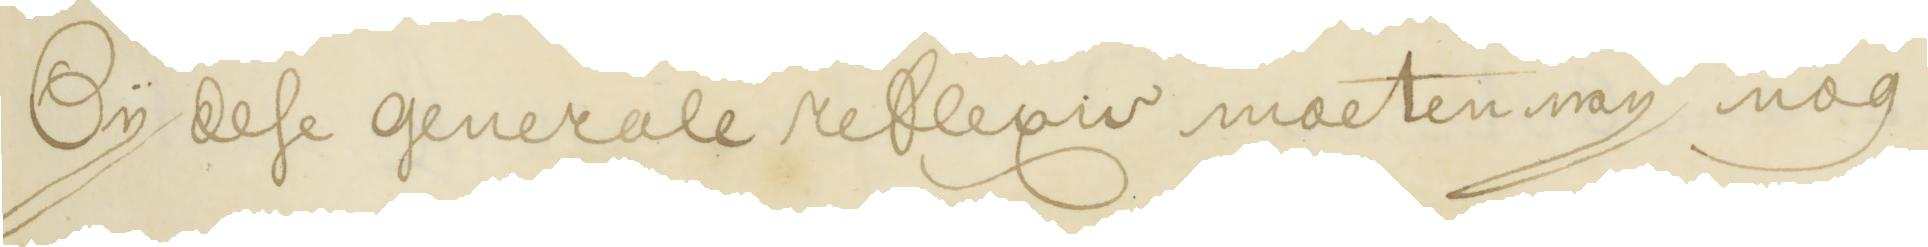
Bij dese generale reflexie moeten wy nog
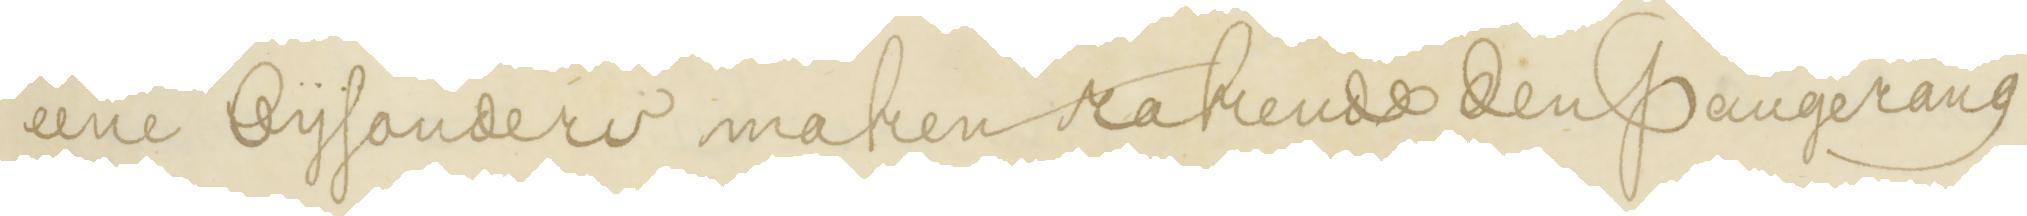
eene bijsondere maken rakende den Pangerang
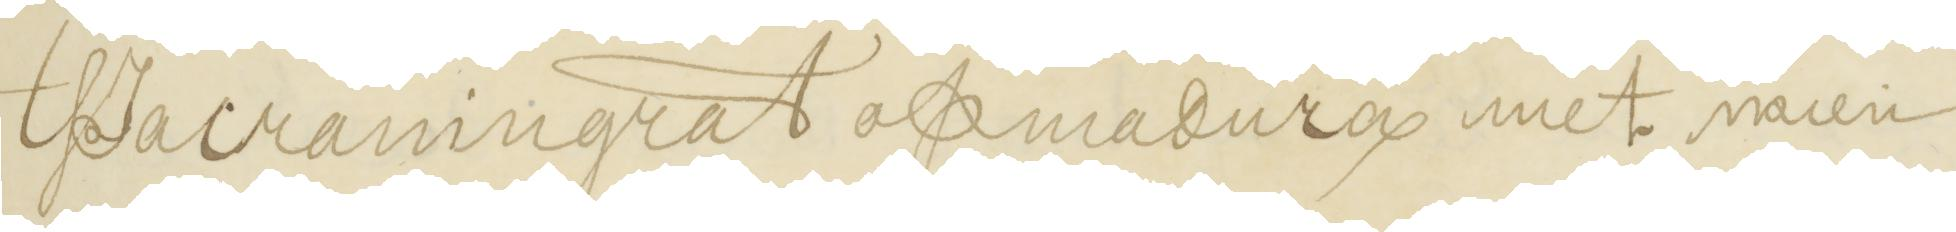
tsjacraningrat op madura met wien
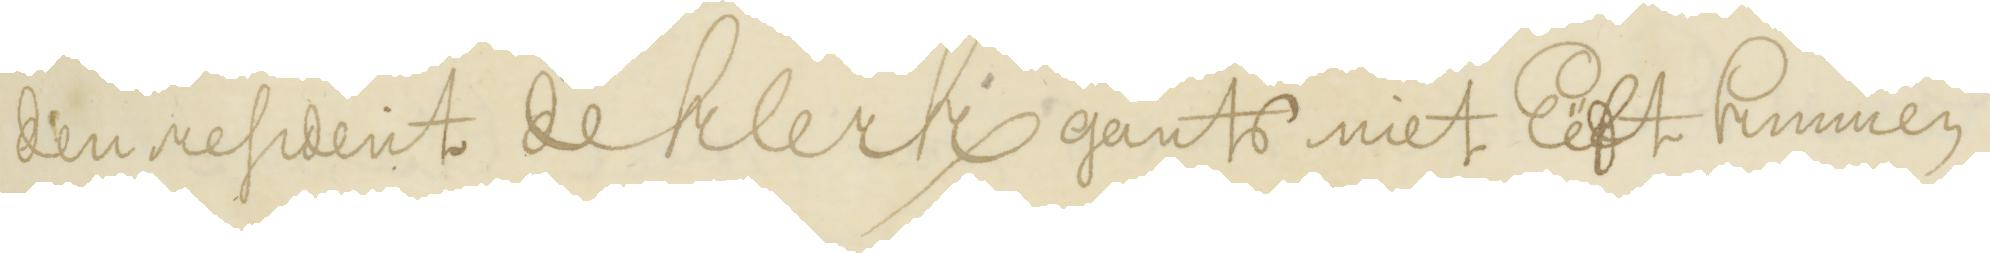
den resident de klerk gants niet hëft kunnen
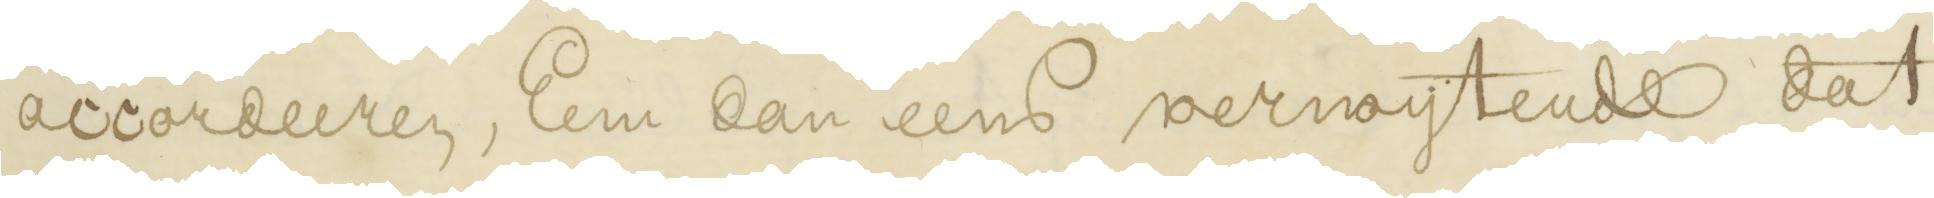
accordeeren, hem dan eens verwijtende dat
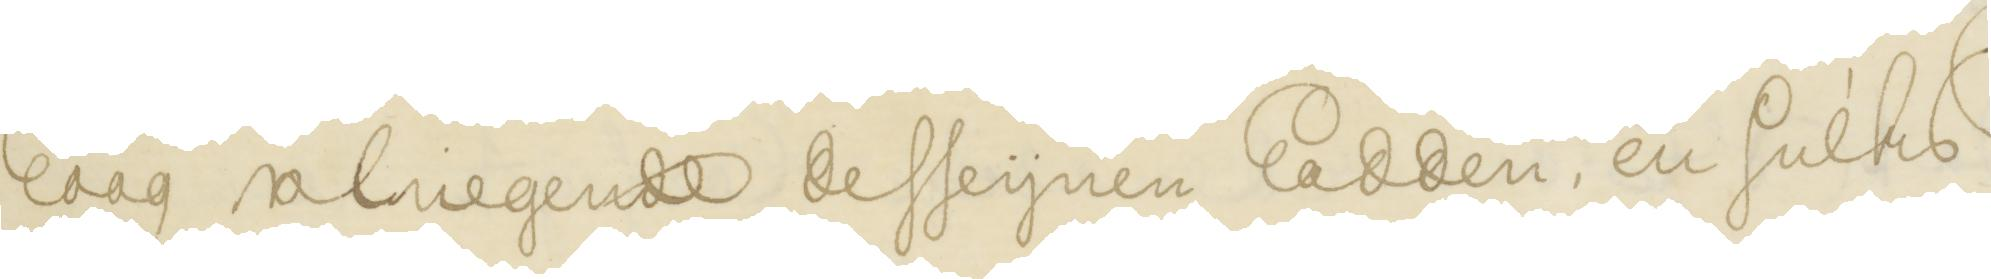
hoog vliegende desseijnen hadden, en Sulks
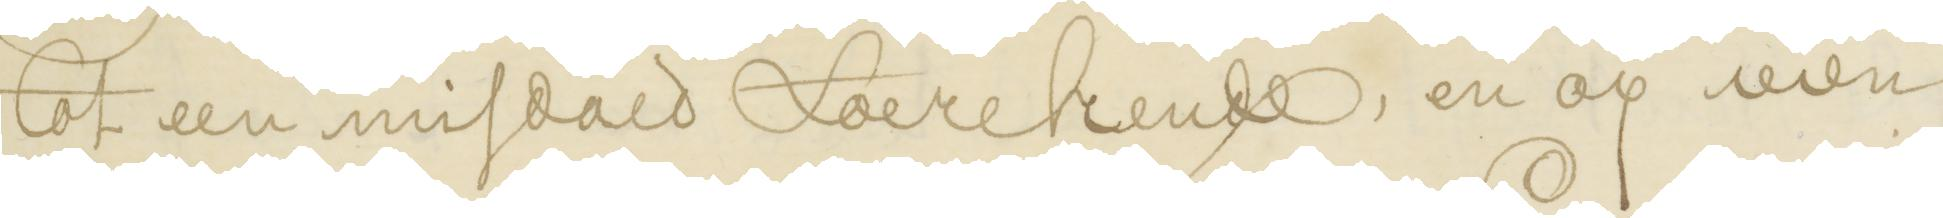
tot een misdaed Toerekende, en op een
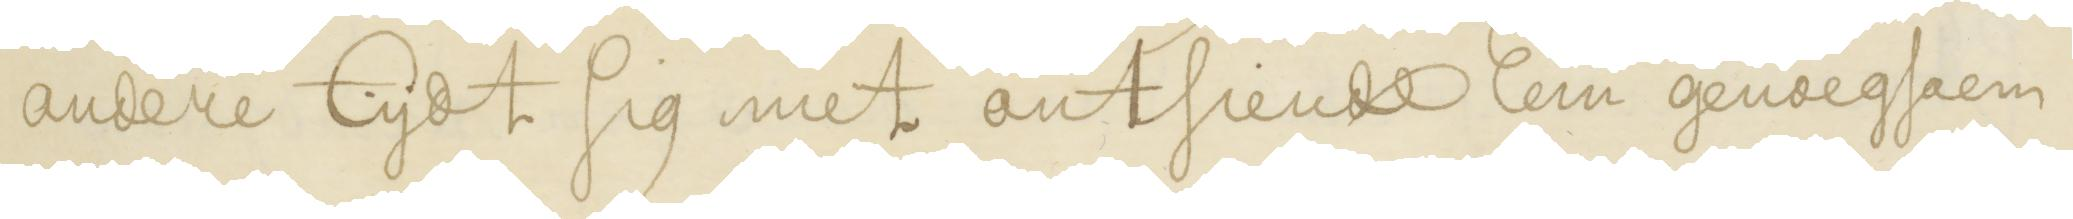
andere Tijdt sig niet ontsiende hem genoegsaem
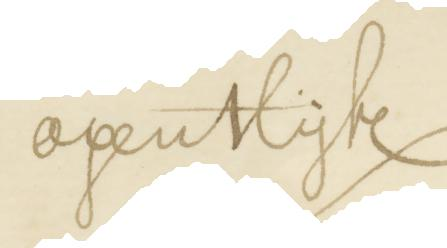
opentlijk
